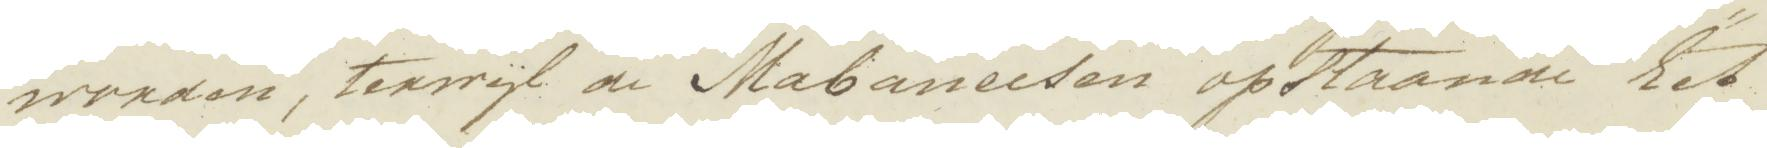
worden, terwijl de Mabaneesen opstaande het
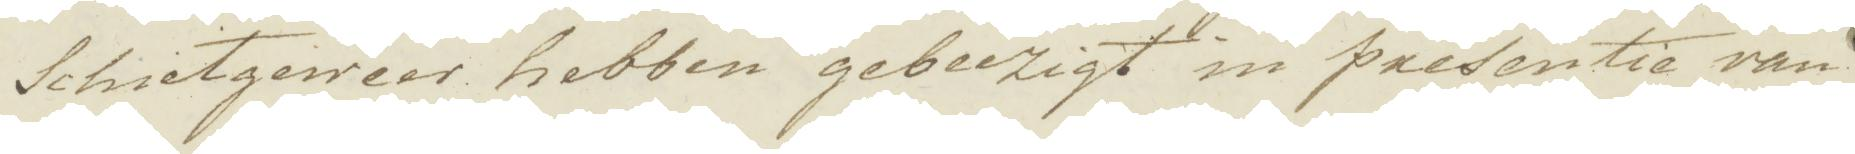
schietgeweer hebben gebeezigt in presentie van
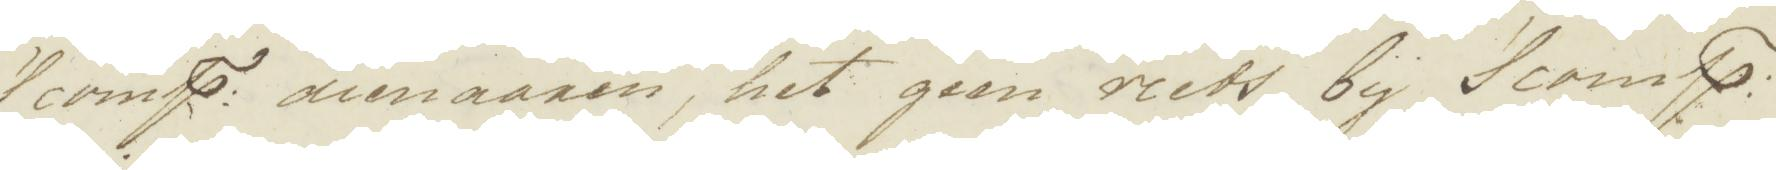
’Scomp: dienaaren, het geen reeds bij 'Scomp:
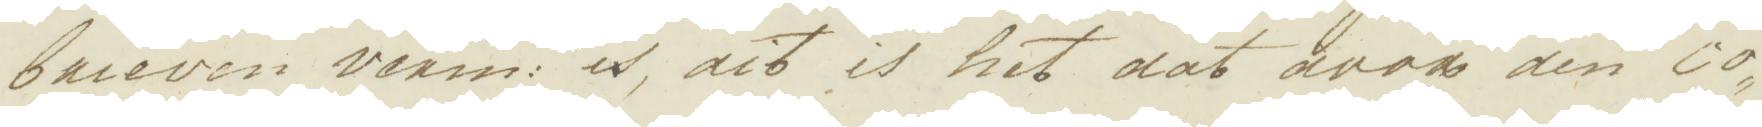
brieven verm: is, dit is het dat door den Co„
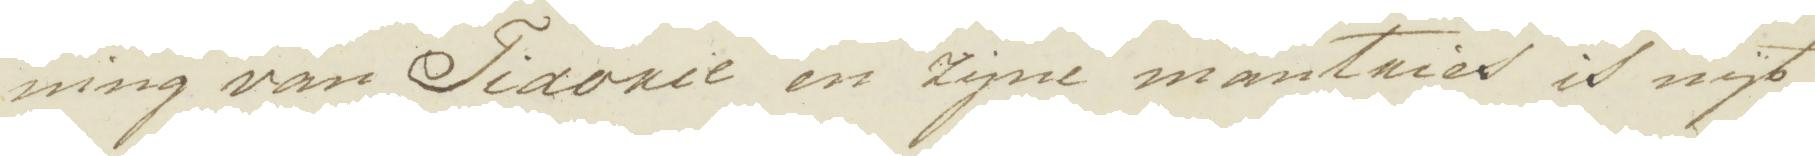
ning van Tidorie en zijne mantries is uit
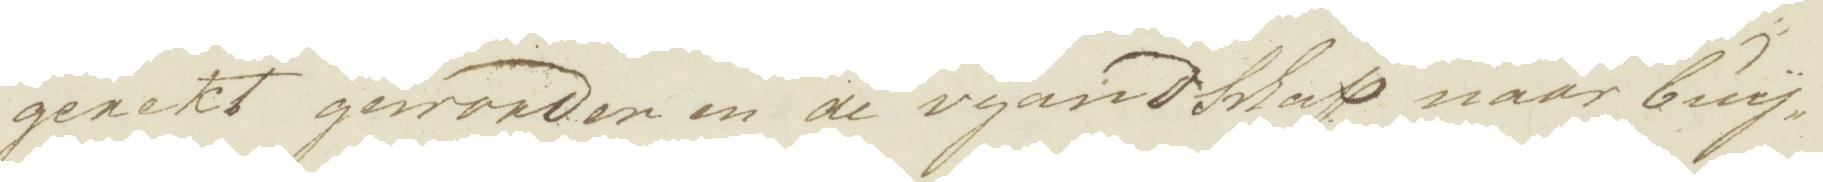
gerekt geworden en de vyandschap naar buij„
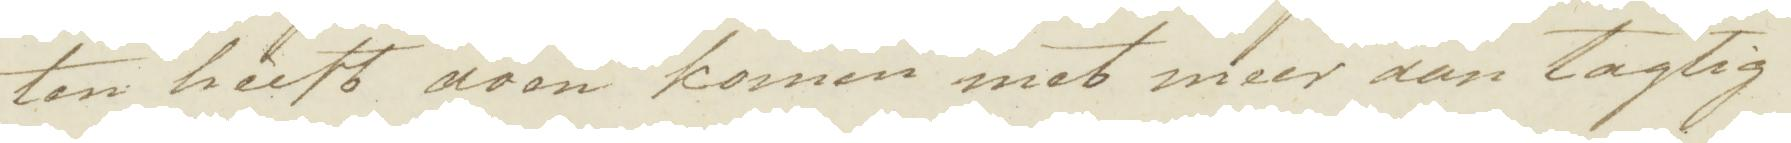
ten heeft doen komen met meer dan tagtig
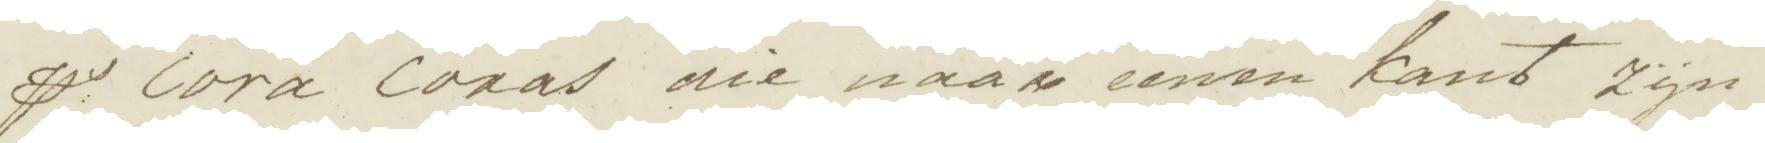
p:s Cora Coras die naar eenen kant zijn
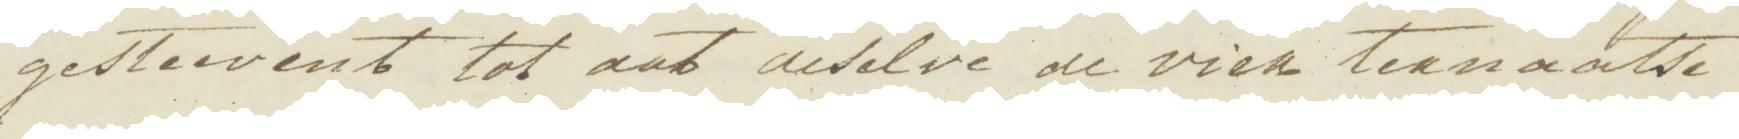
gesteevent tot dat deselve de vier ternaatse
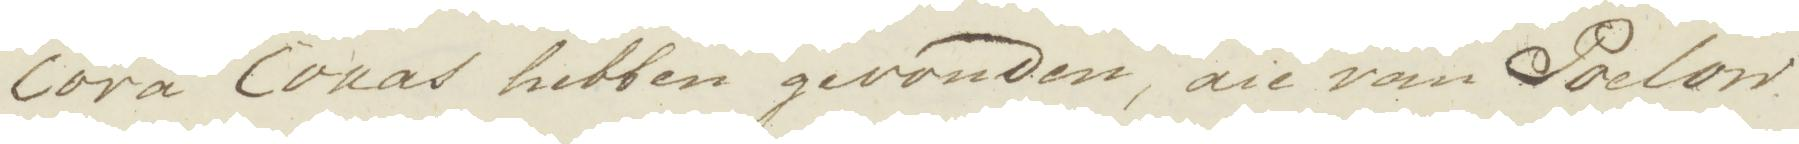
Cora Coras hebben gevonden, die van Poelow
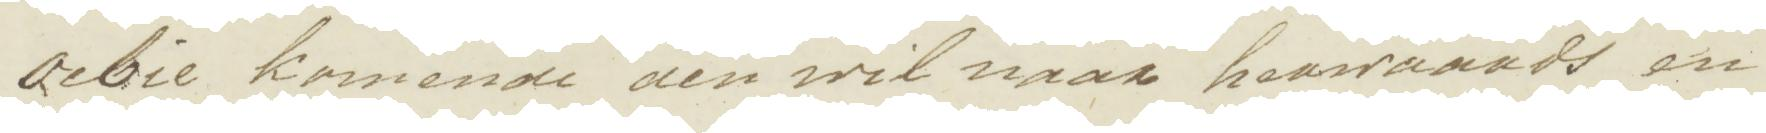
oebie komende den wil naar herwaards en
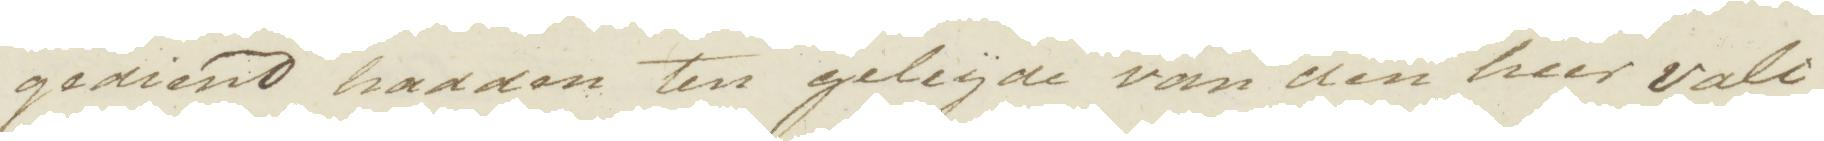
gediend hadden ten geleijde van den heer valc
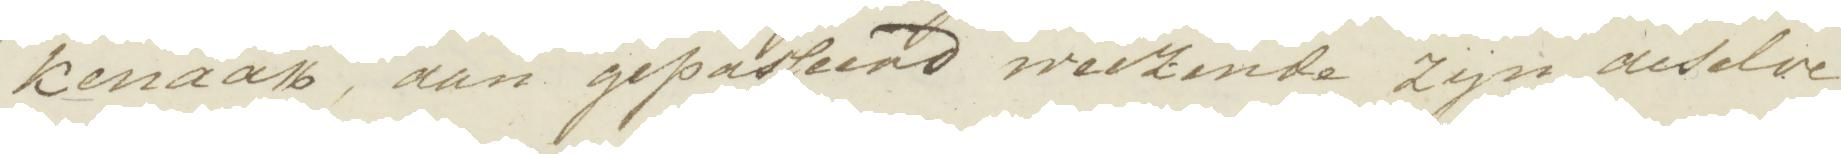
kenaar, dan gepasseerd weezende zijn deselve
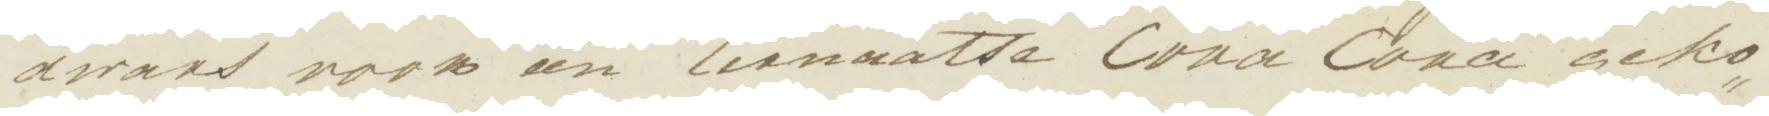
dwars voor een ternaatse Cora Cora geko„
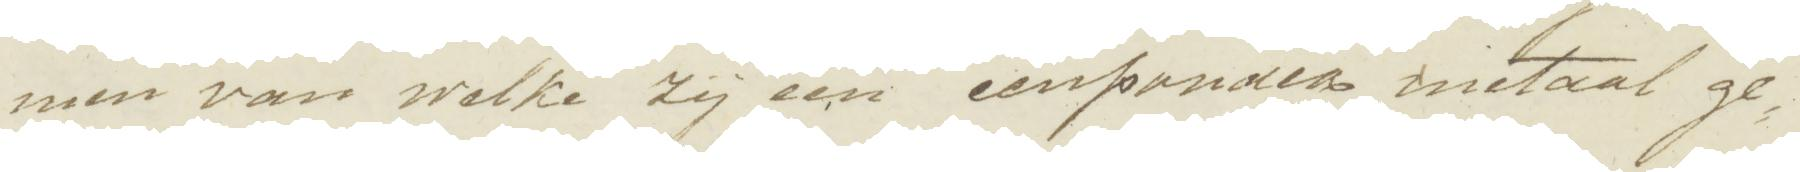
men van welke zij een eenponder metaal ge„
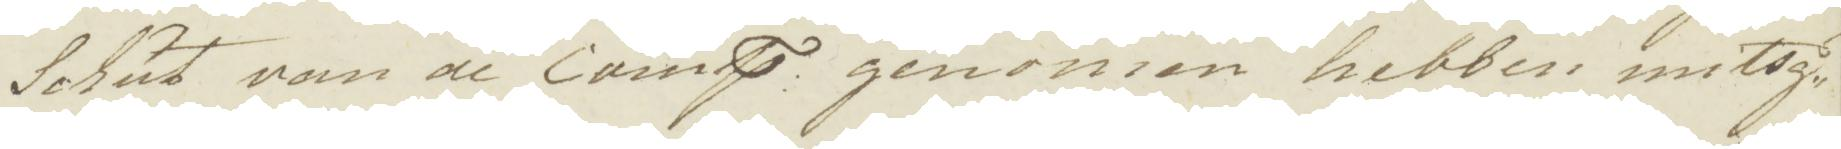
schut van de Comp: genomen hebben mitsg„s
